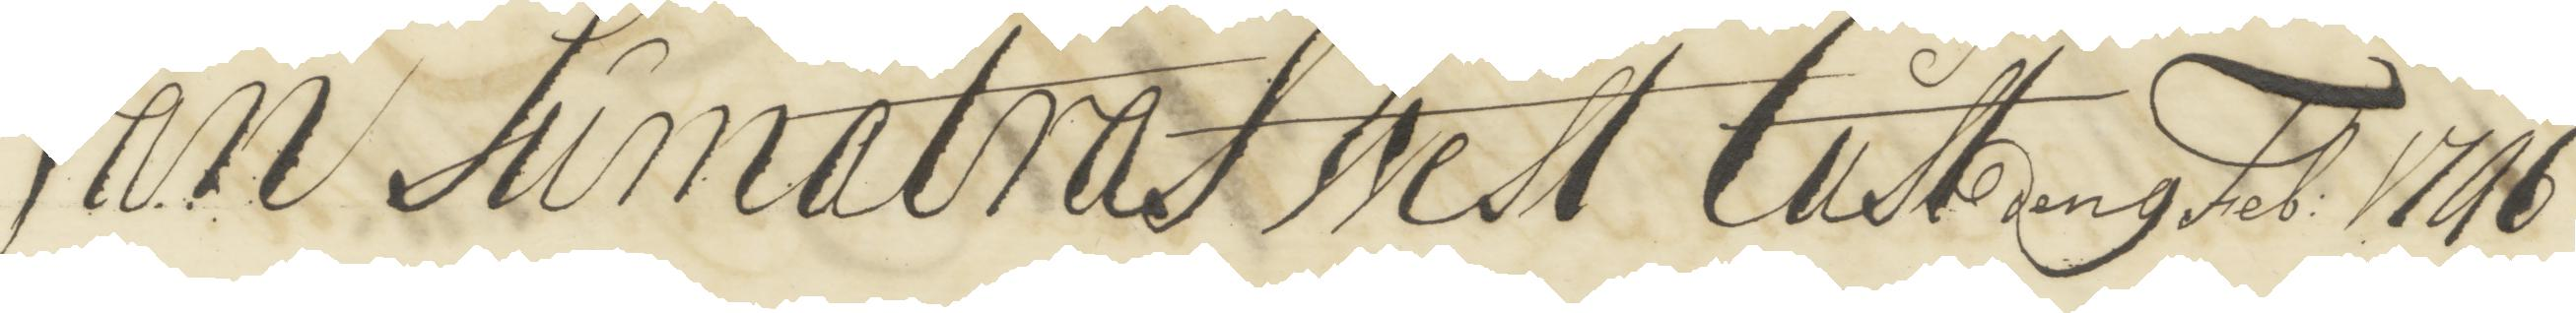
Van Sumatras West Cust den 9 Feb: 1746
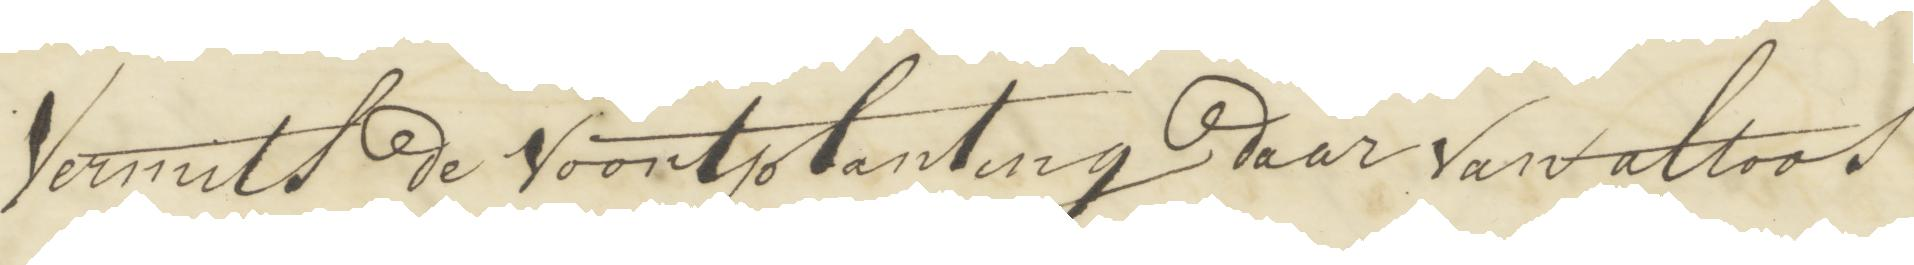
Vermits de voortplanting daar van altoos
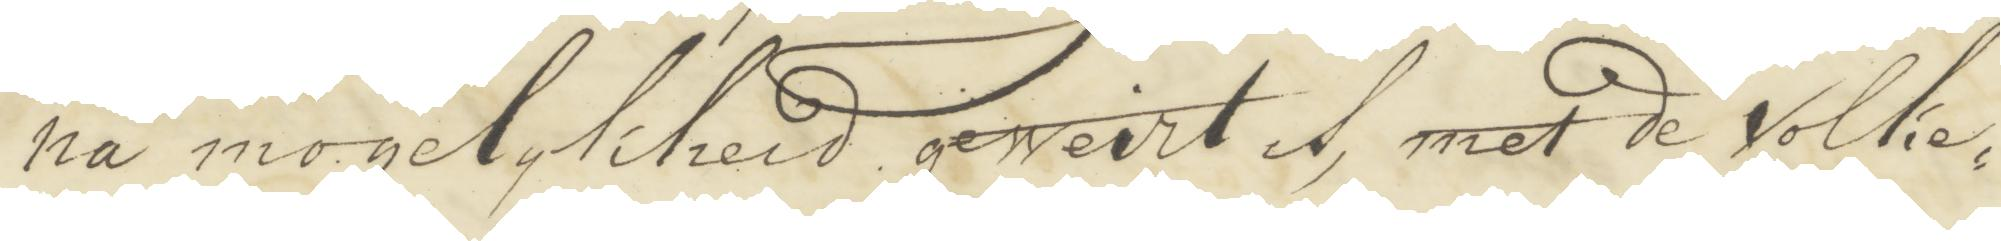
na mogelykheid geweirt is, met de volke„
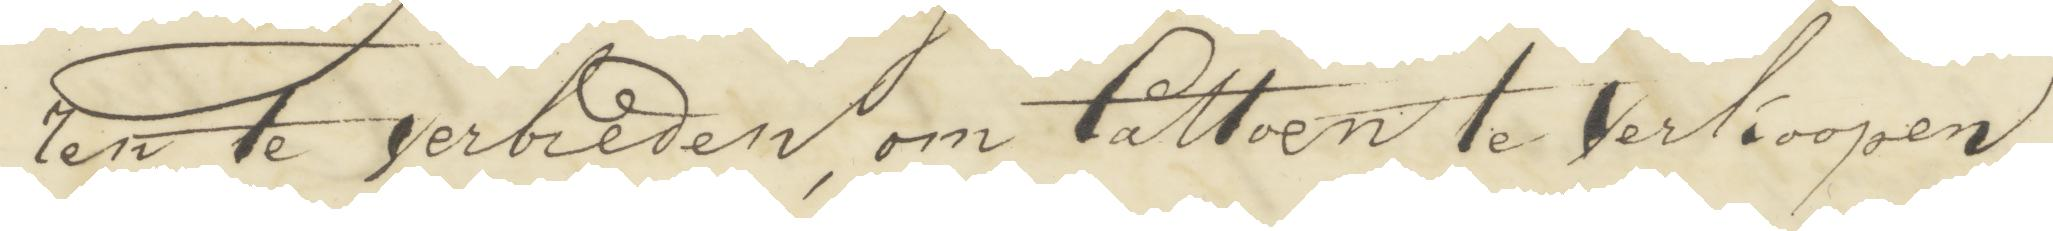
ren te verbieden, om Cattoen te verkoopen
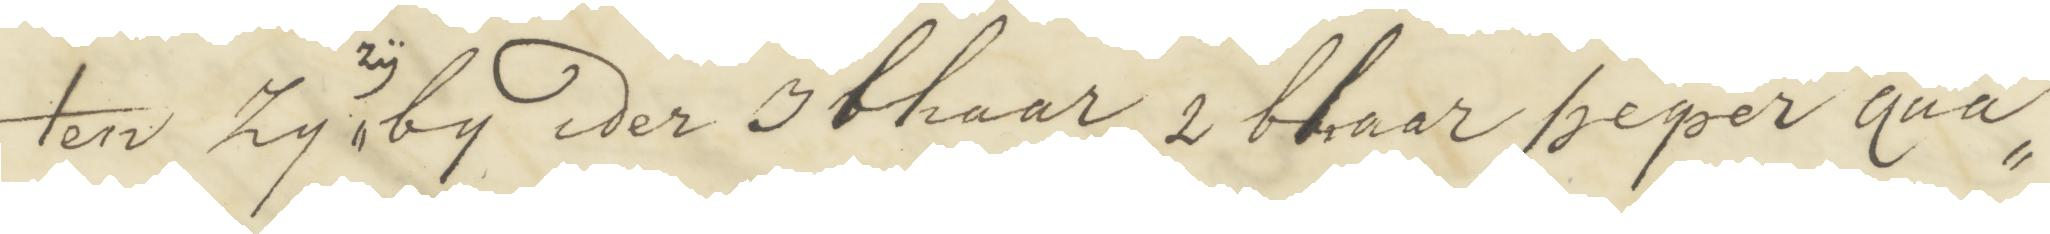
ten zy „zij by ider 3 bhaar 2 bhaar peper qua„
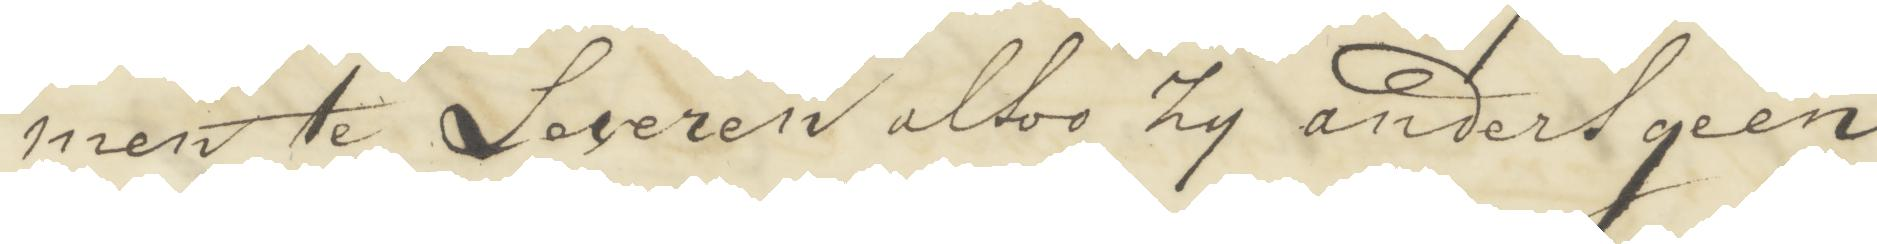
men te leveren alsoo zy anders geen
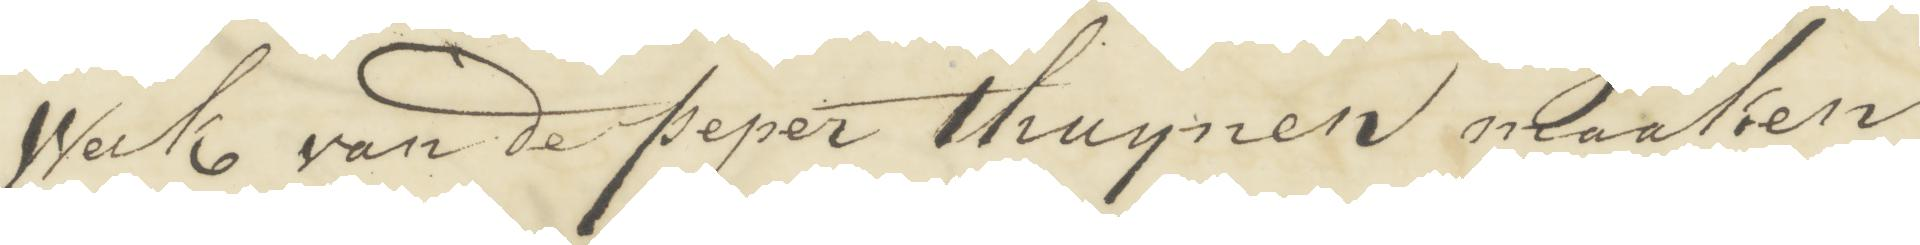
weck van de peper thuynen maaken,
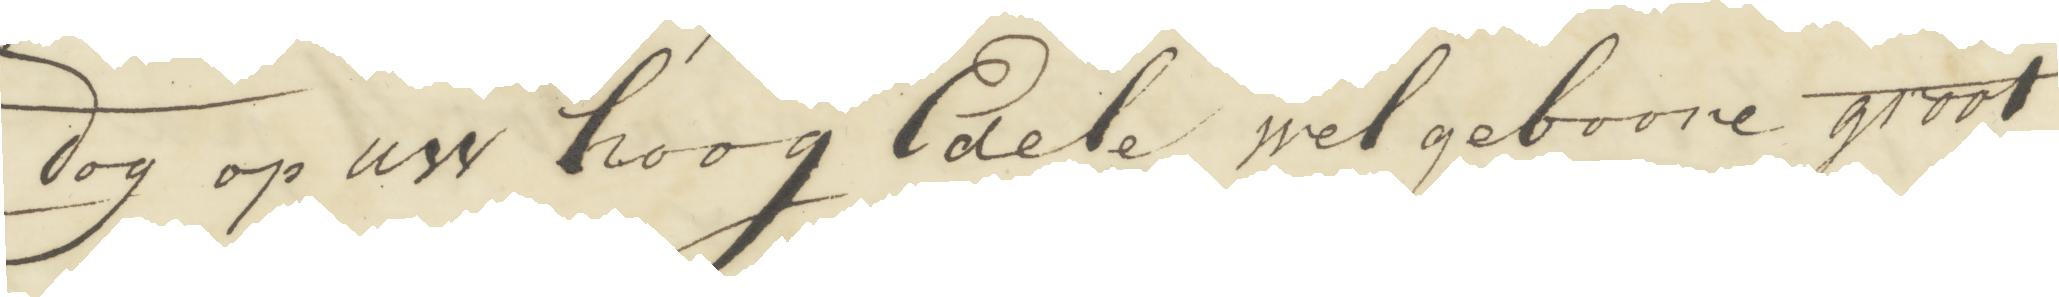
dog op uw hoog Edele wel geboore groot
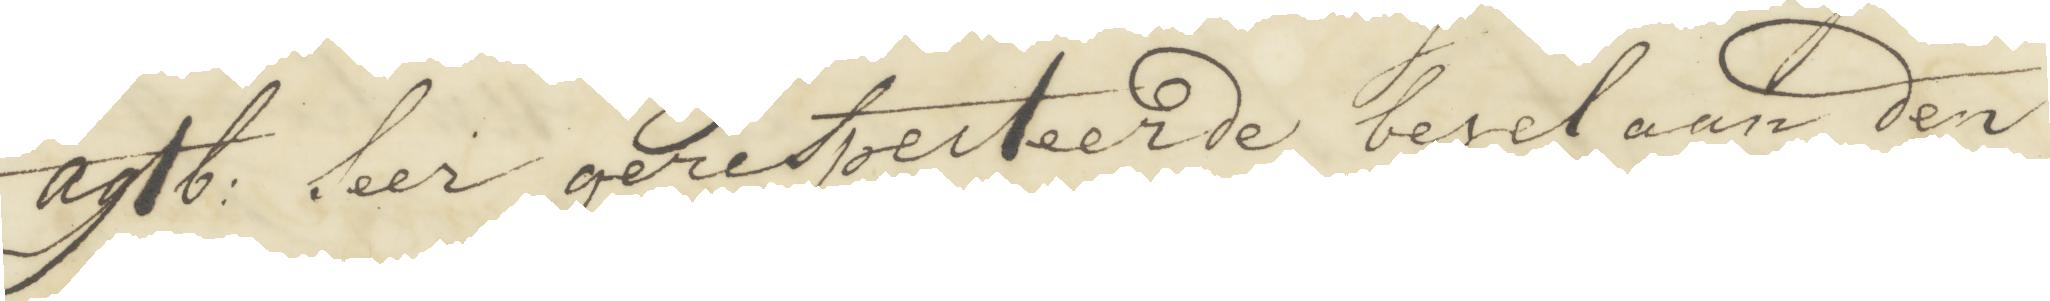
agtb: seer gerespecteerde bevel aan den
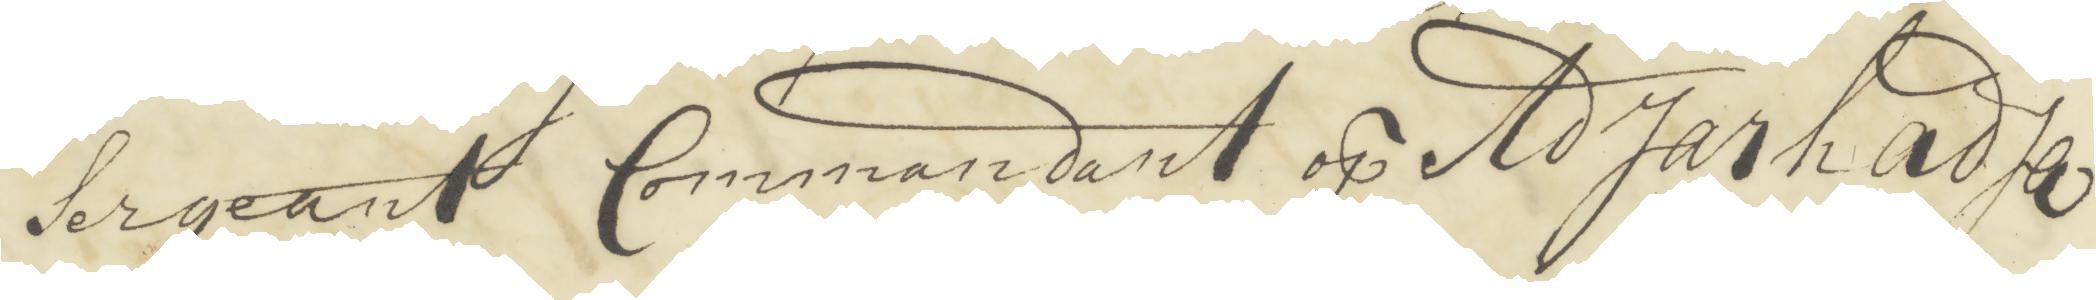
sergeant Commandant op Adjarhadja
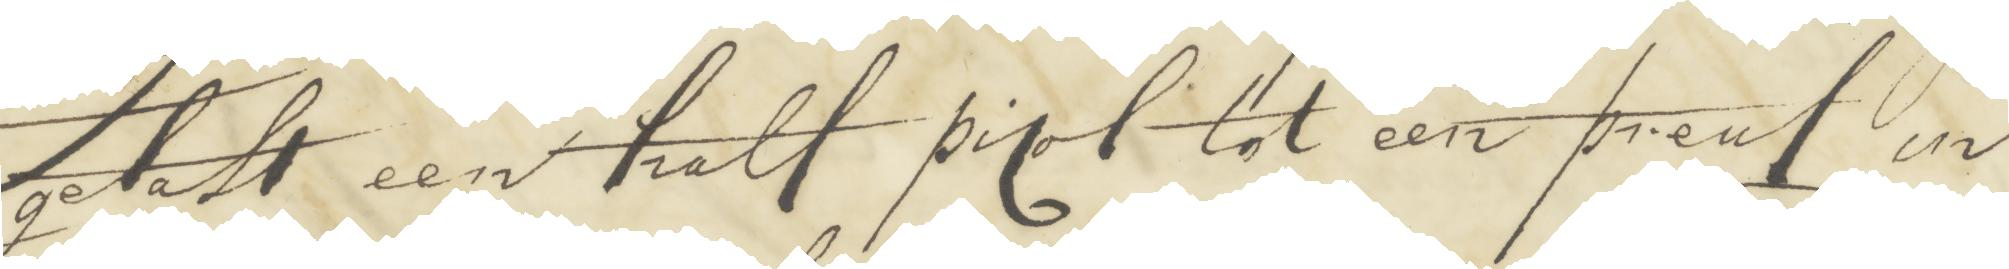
gelast een half picol tot een preuf in
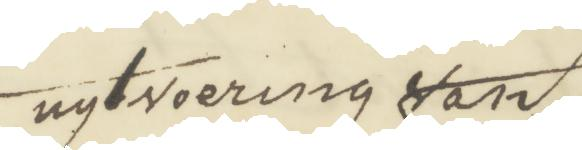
uytvoering van
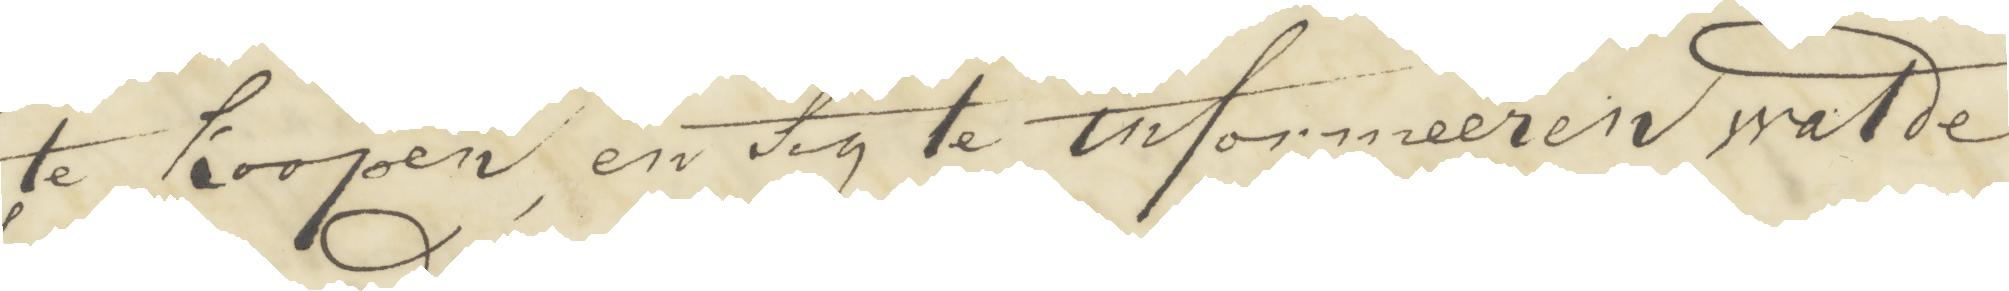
te koopen, en sig te informeeren wat de
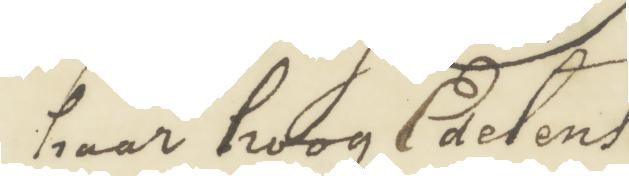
haar hoog Edelens
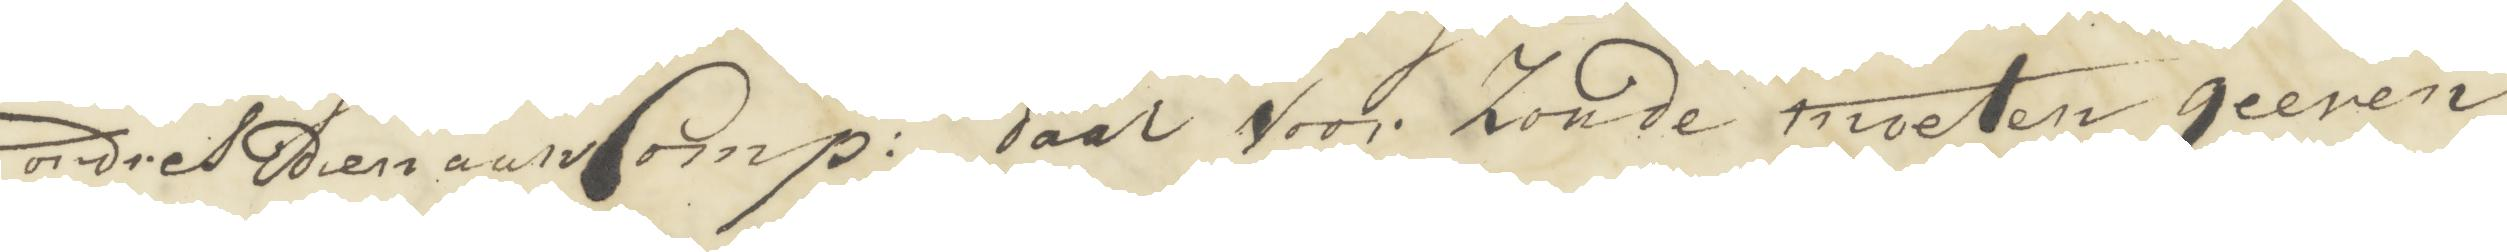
ordres dien aan Comp: daar voor zoude moeten geeven
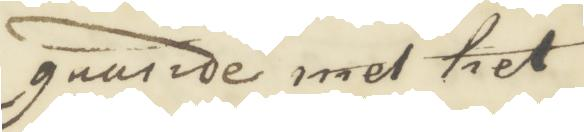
gaande met het
